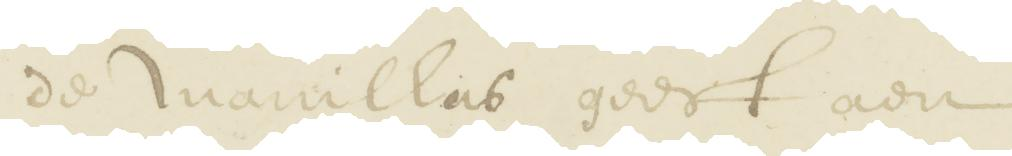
de manillas geeft aen
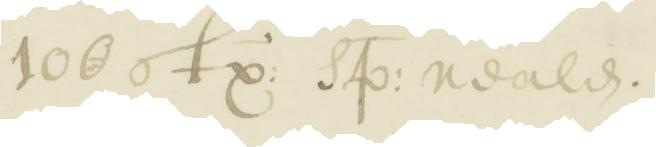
100 stx: sp: realen.
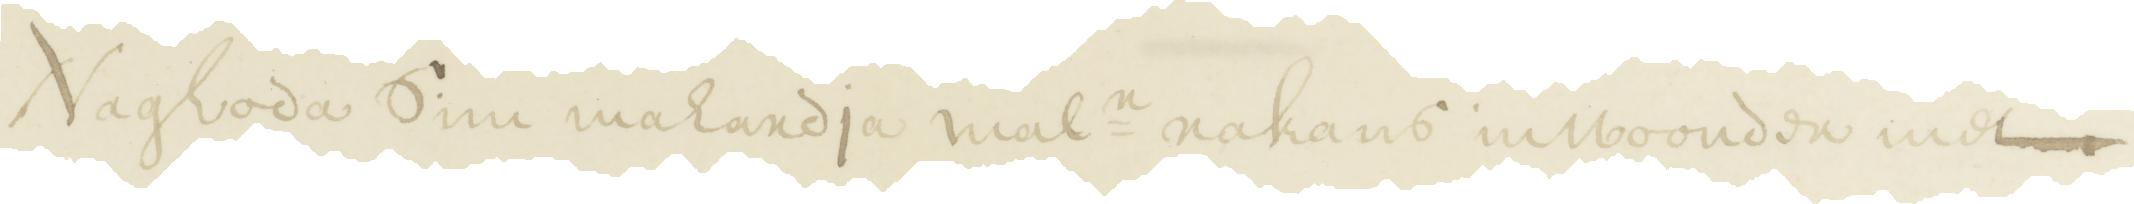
Naghoda Sim mahardja mal=r rakans inwoonder met
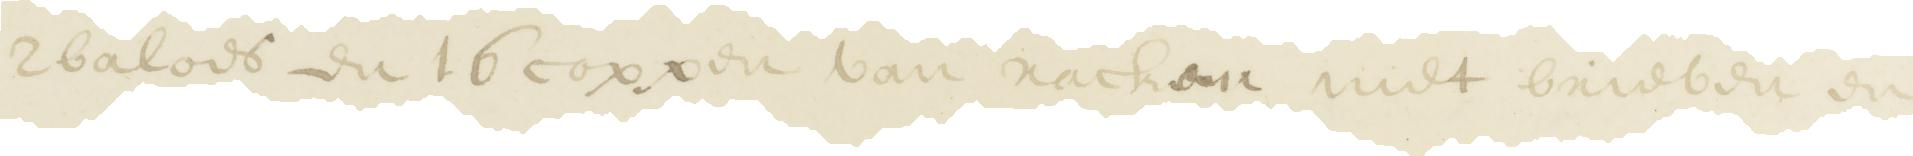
2 baloes en 16 coppen van racken met brieven en
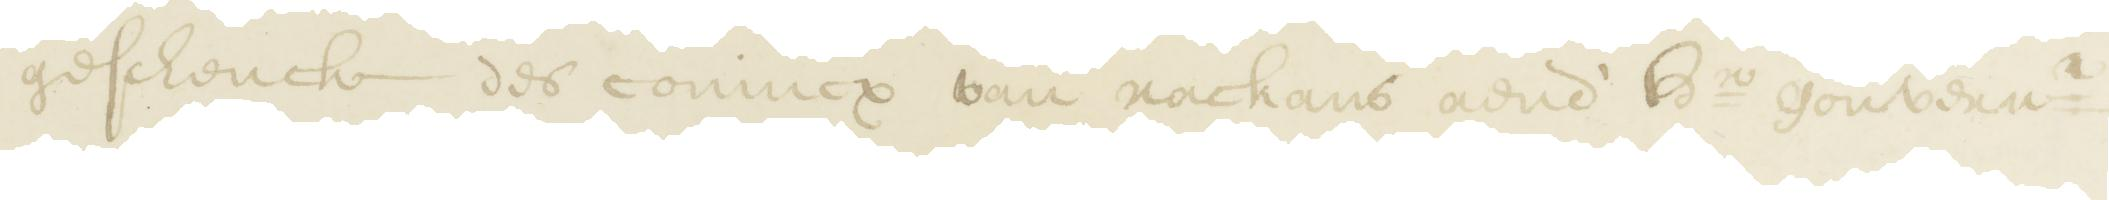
geschenck des conincx van rackans aen d’ H=r gouvern=r
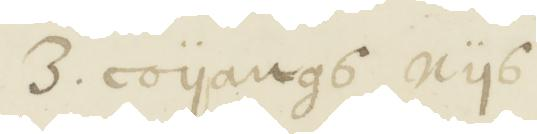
3. coijangs rijs
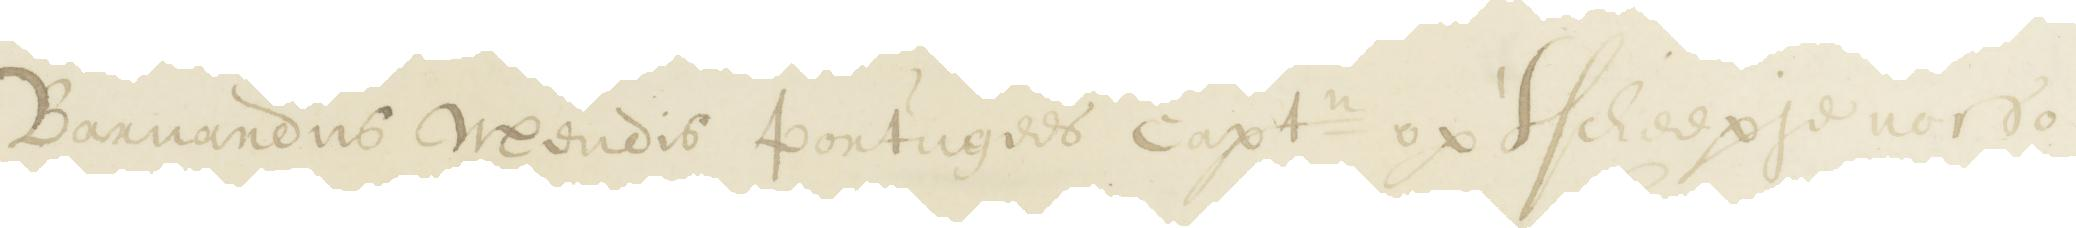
Barnardus mendis portugees capt=n op ’t scheepje nosso
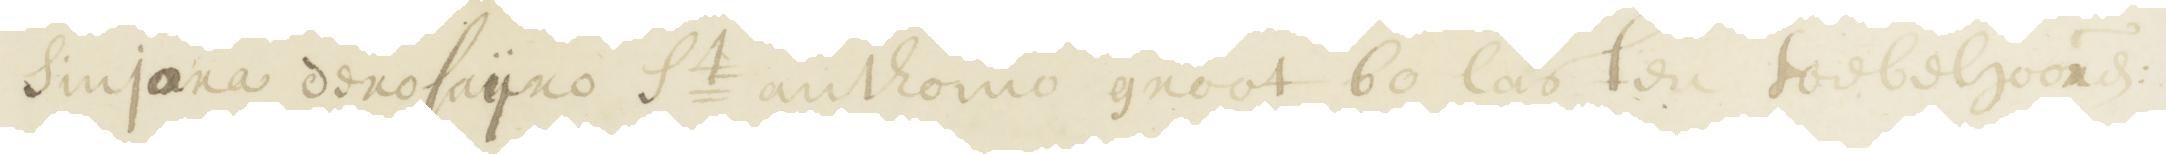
sinjora derosaijro S=t anthonio groot 60 lasten toebehooren:
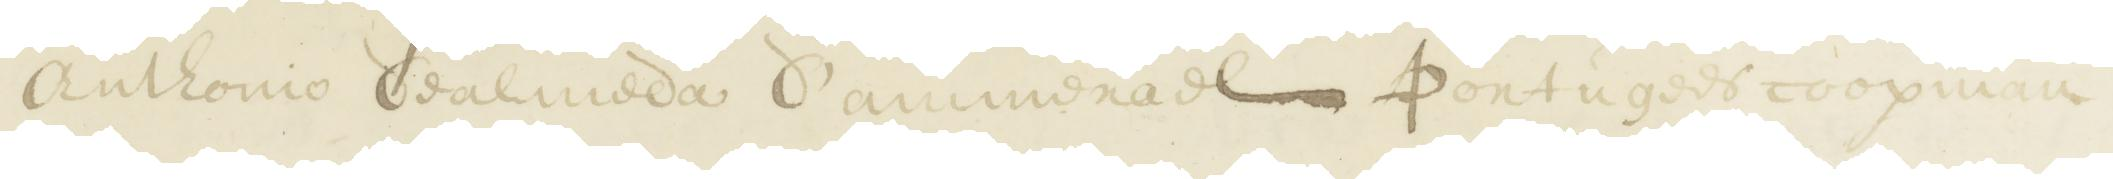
Anthonio dealmeda d’ammerael portugees coopman
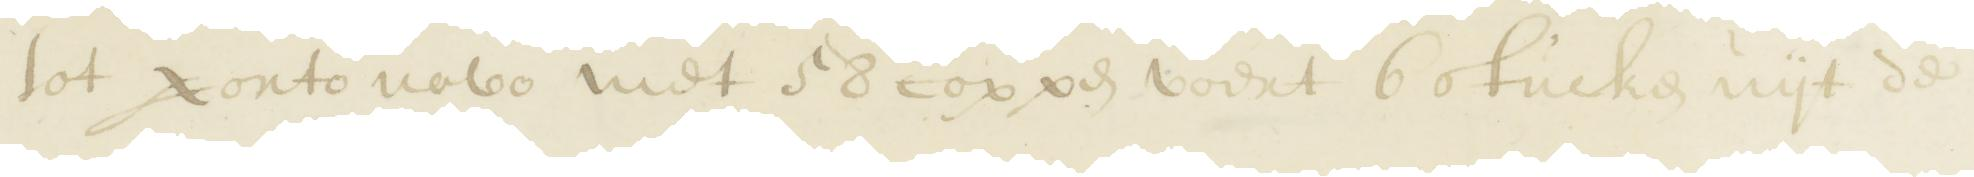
tot porto novo met 58 coppen voert 6 stucken uijt de
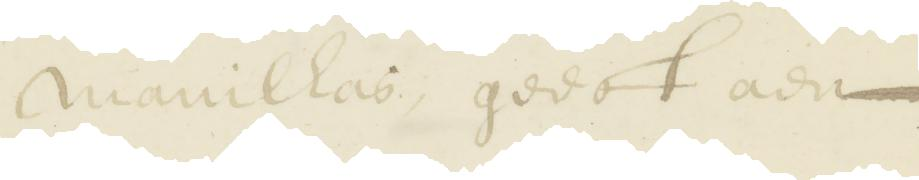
manillas, geeft aen
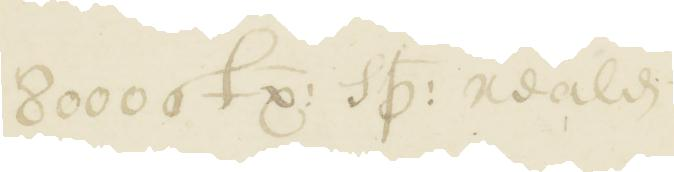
8000 stx: sp: realen
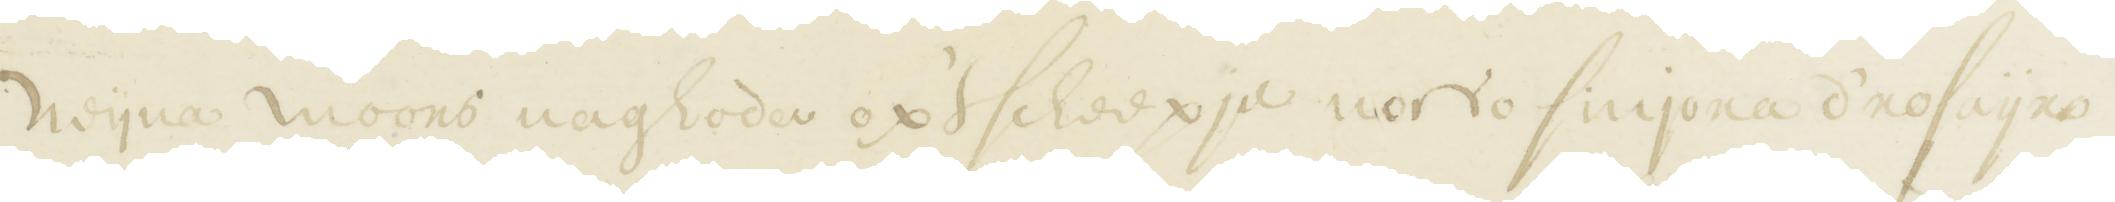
neijna moors naghoda op ’t scheepje nosso sinjora d'rosaijro
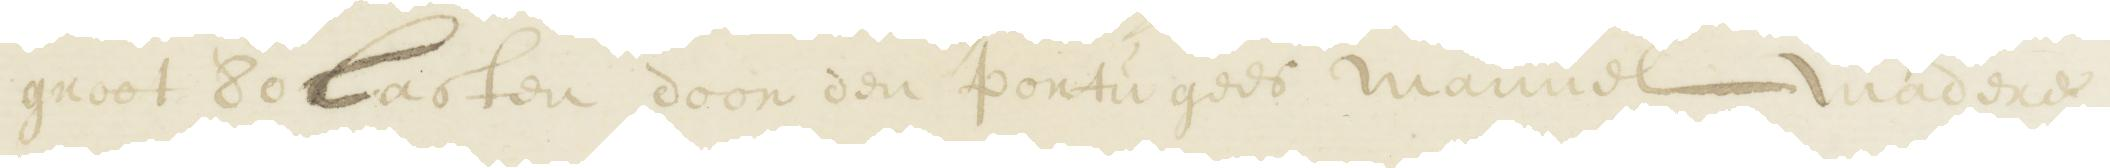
groot 80 lasten door den portugees manuel madere
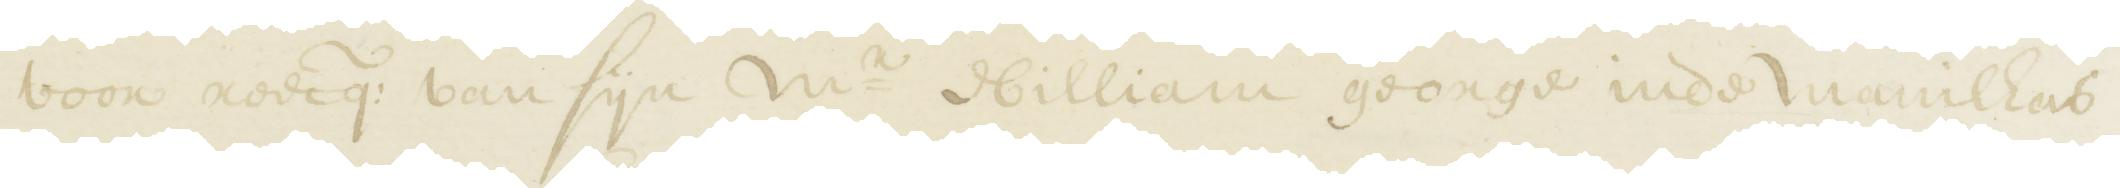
voor reecq: van sijn m=r william george in de manilhas
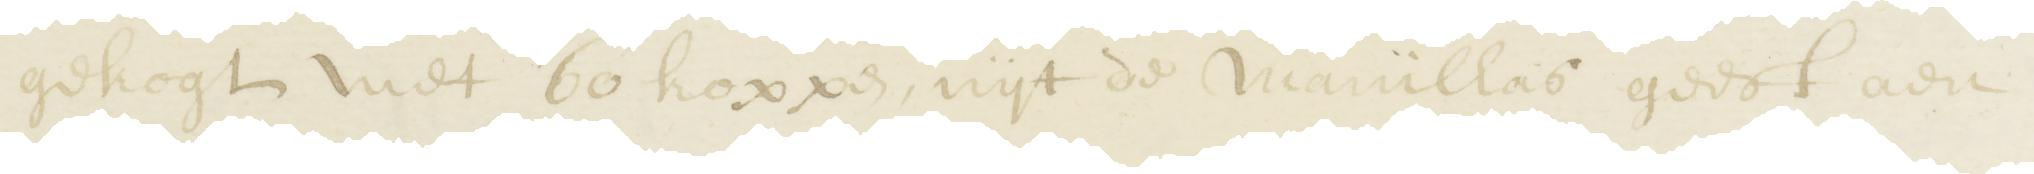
gekogt met 60 koppen, uijt de manïllas geeft aen
